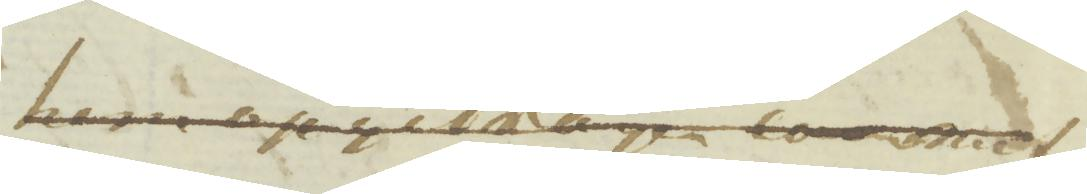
hem opgedragen constant
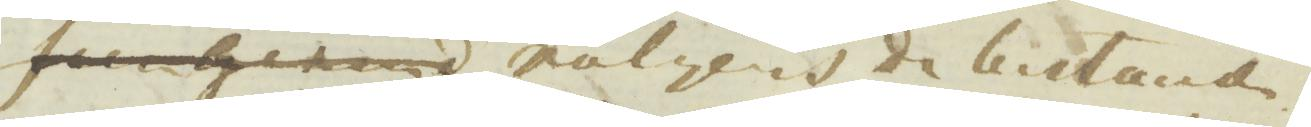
foegekend volgens de bestaande
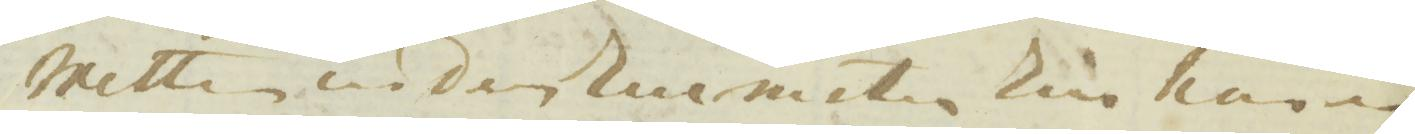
wetten in den ruimsten Zin kan en
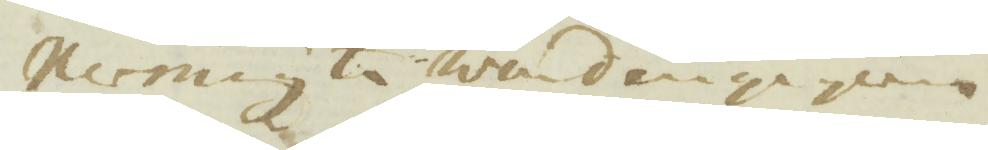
vermag te worden gegeven
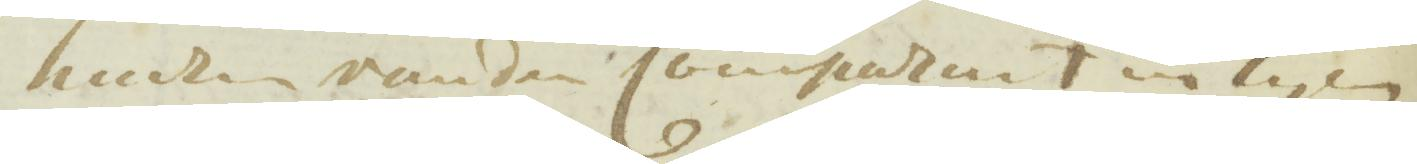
huizen van den Comparant in tegen
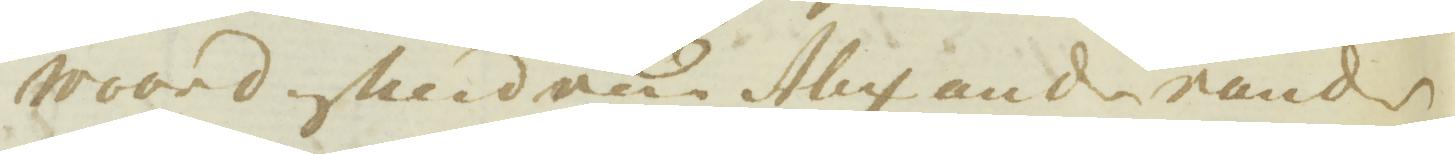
woordigheid van Alexander vander
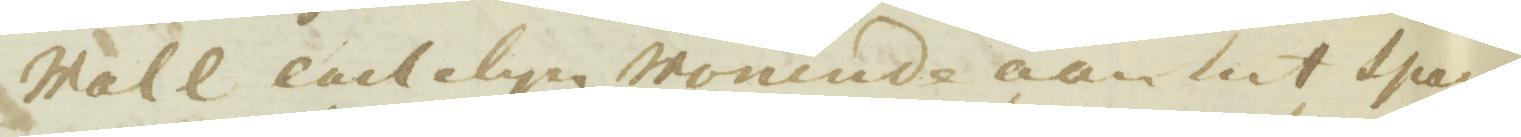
Wall castelijn wonende aan het Spaer
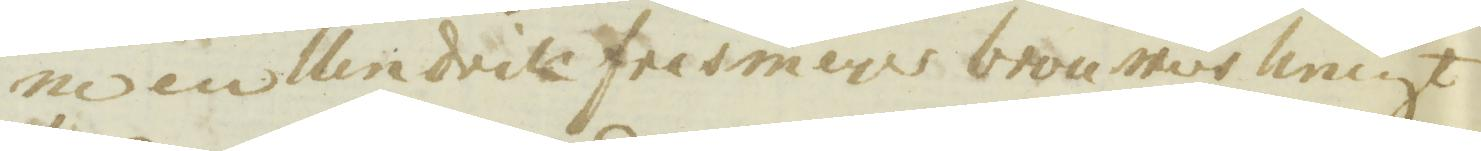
ne en Hendrik fresmeyer brouwersknegt
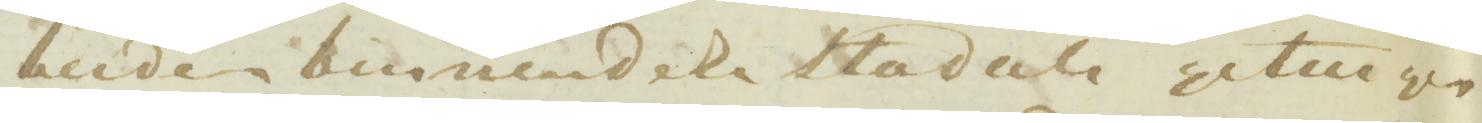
beiden binnen deze stad als getuigen
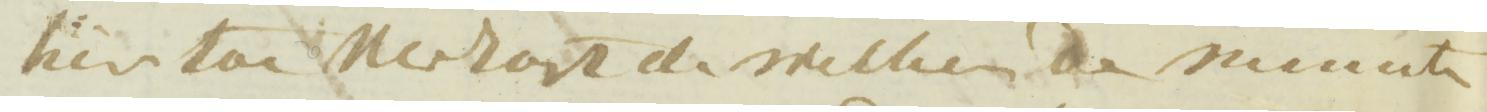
hiertoe verzogt de welken de minute
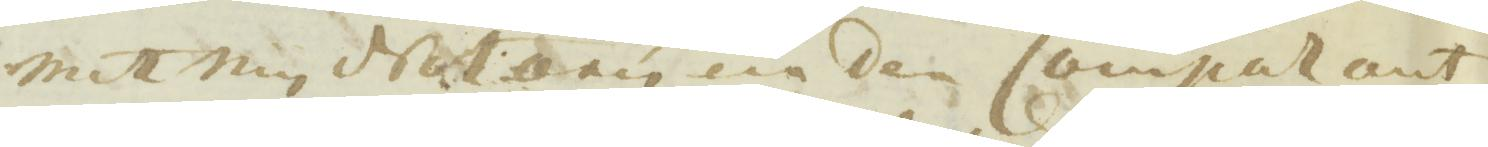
met my Notaris en den Comparant
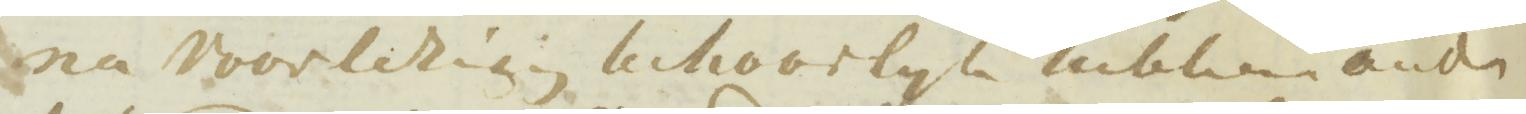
na voorlezing behoorlyk hebben onder
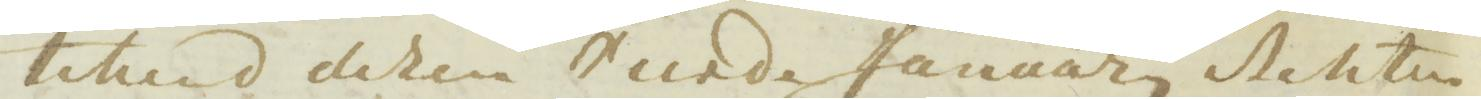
tekend dezen Vierde Januari Achtien
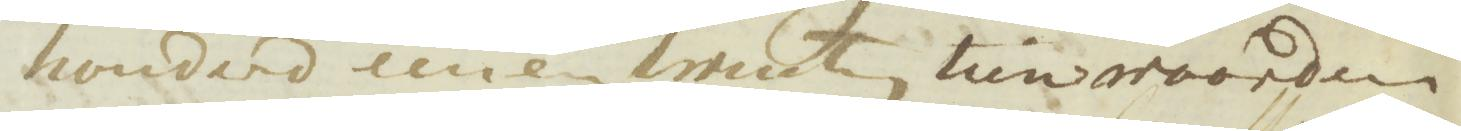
honderd eenen twintig tien woorden
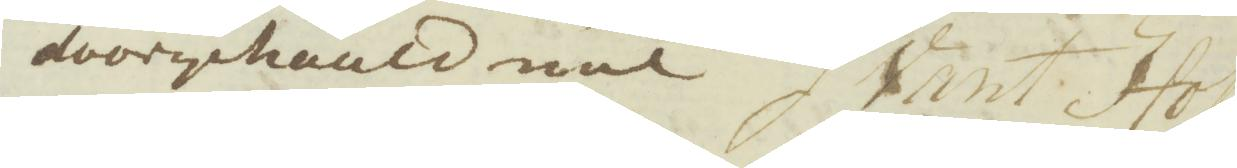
doorgehaald nul J Vant Hoff
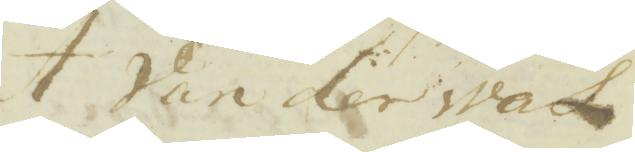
A Van der wal
